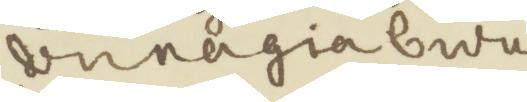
den ragia biers
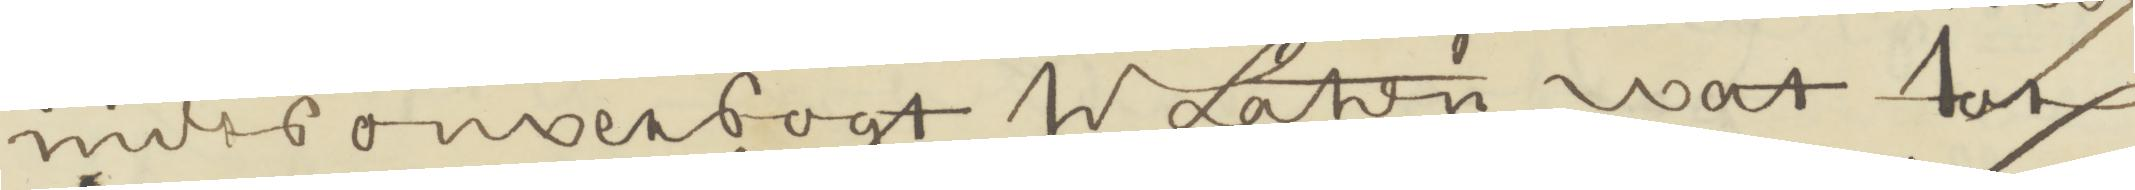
niets onversogt te laten wat tot
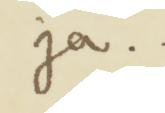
ja.
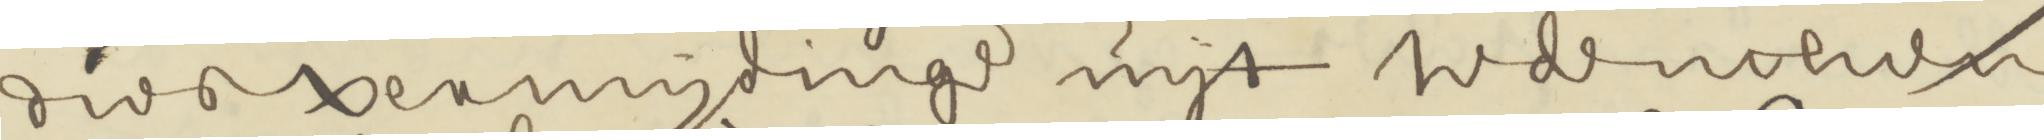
dies vermijdinge uijt te dencken
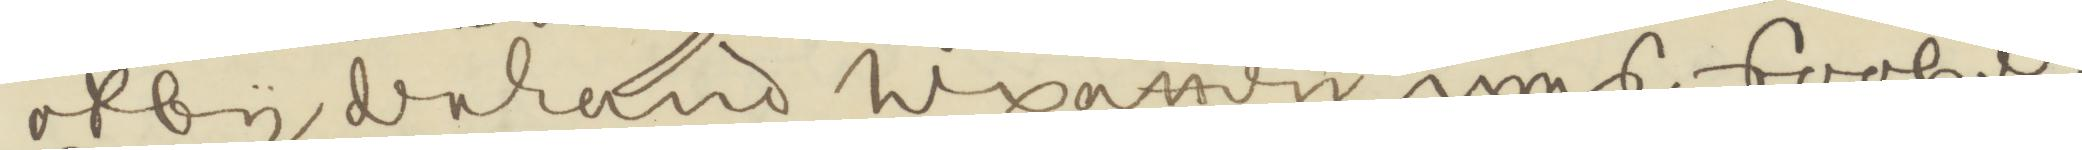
of bij derhand te vatten was, soobe„
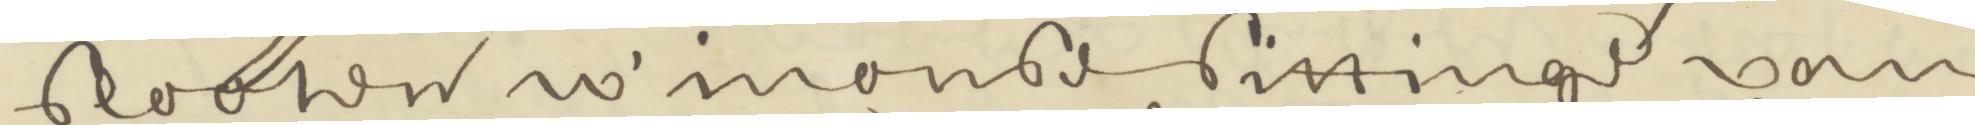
slooten w' in onse sittinge van
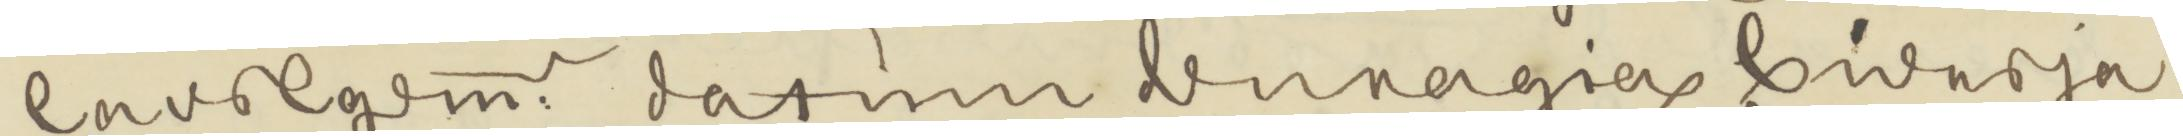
laestgem:e datum den ragia biersja
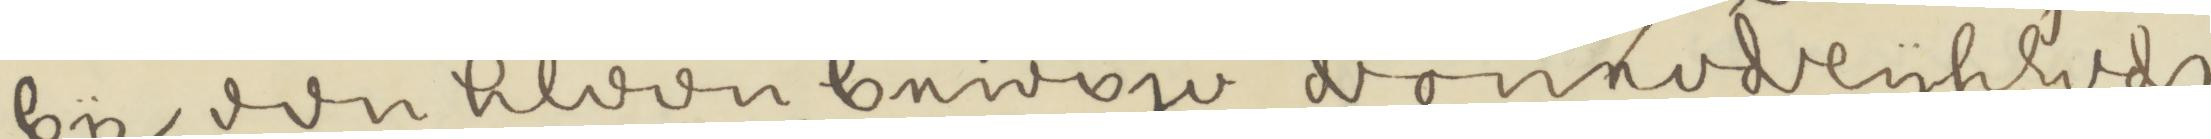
bij een kleen brievje de onredelijkheden
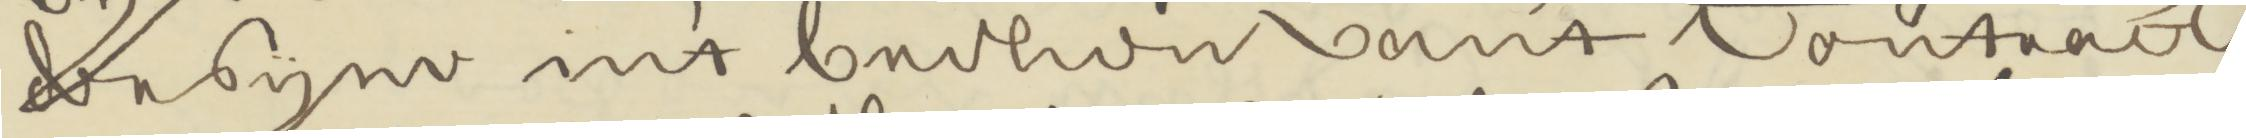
der sijne in't breken van’t Contract
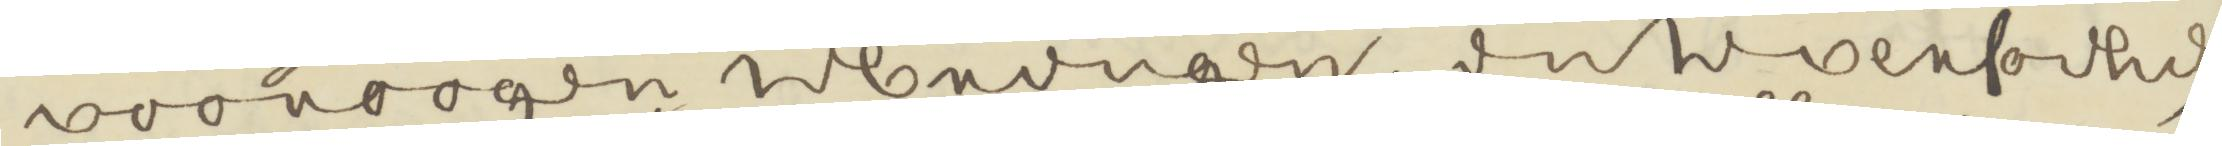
vooroogen tebrengen, en te versoeken
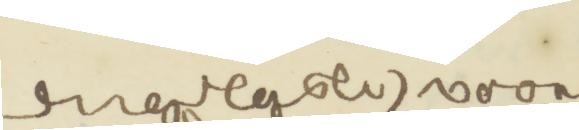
en gelasten voor
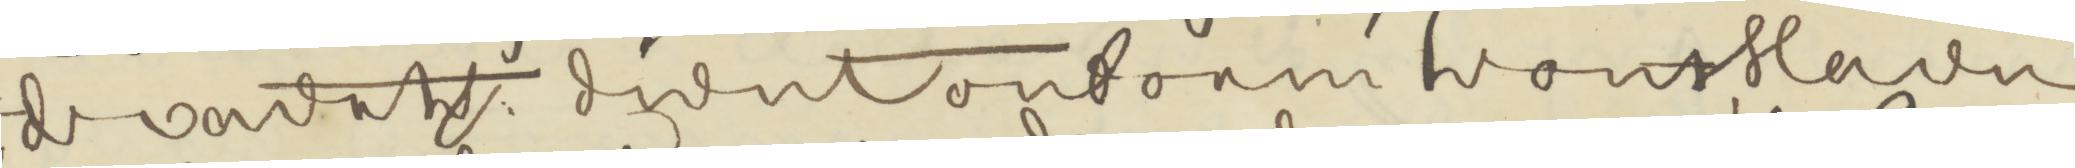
de vaertver dien Conform te ontslaen
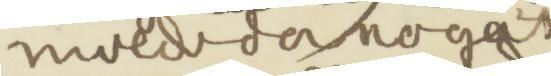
melde danoga't
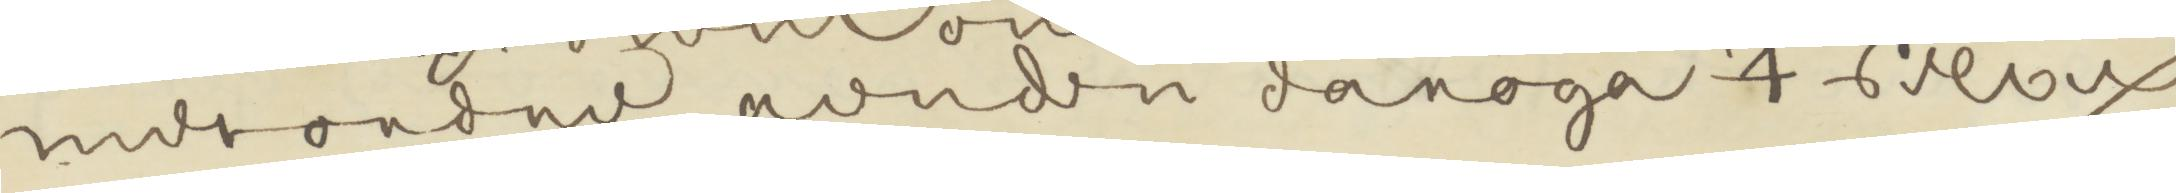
met ordre aen den danoga ’t selve
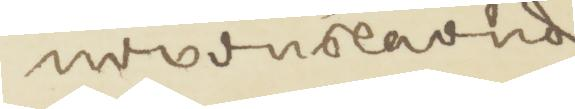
nevenstaende
